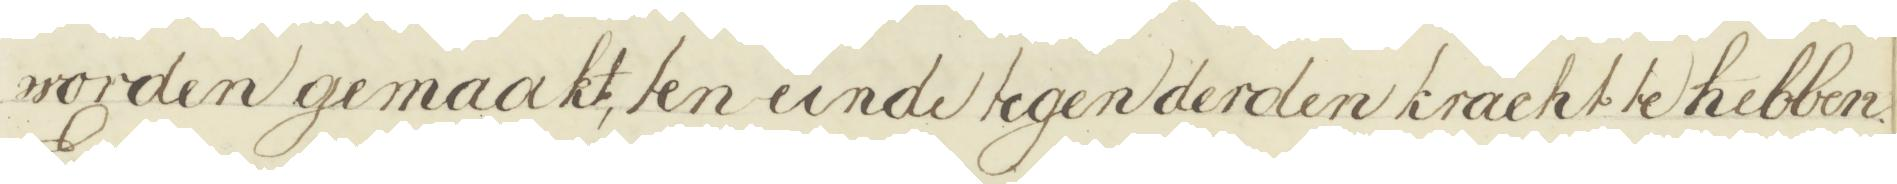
worden gemaakt, ten einde tegen derden kracht te hebben.
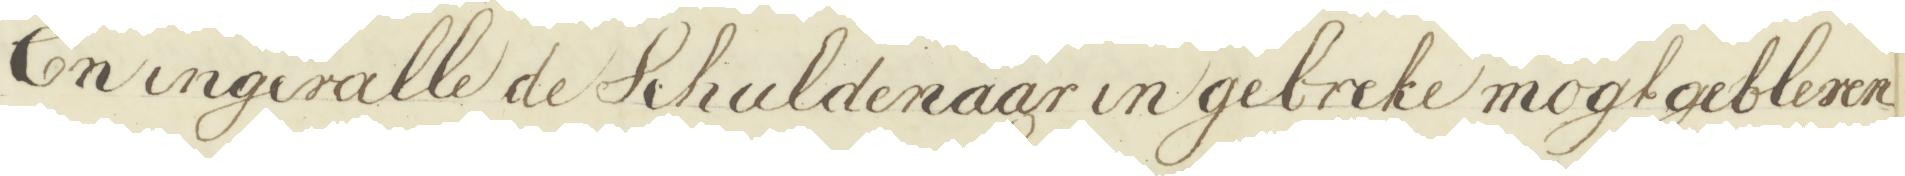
En ingevalle de Schuldenaar in gebreke mogt gebleven
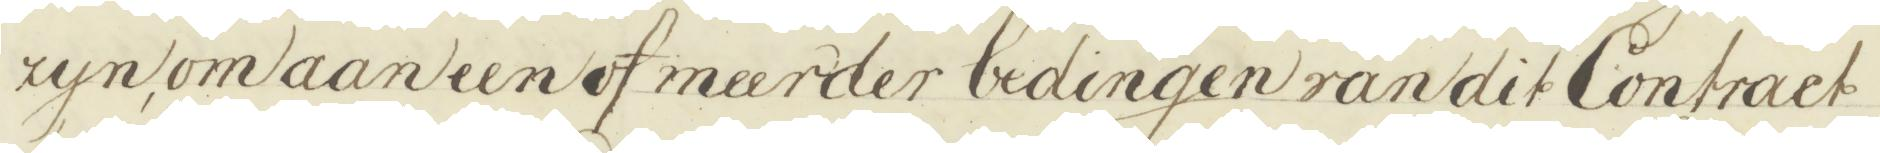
zyn, om aan een of meerder bedingen van dit Contract
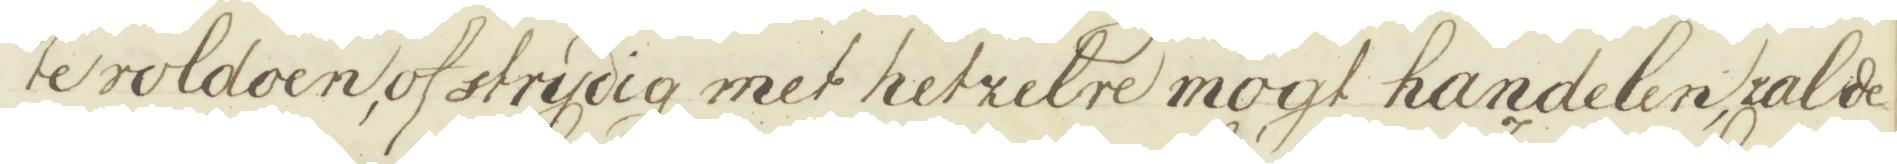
te voldoen, of strydig met hetzelve mogt handelen, zal de
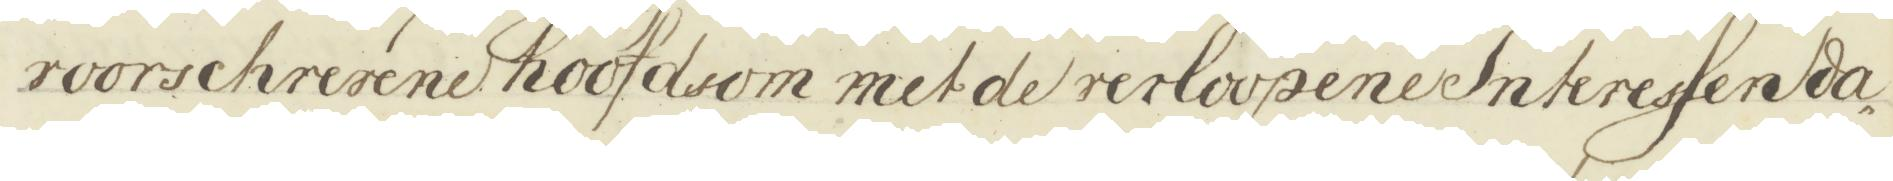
voorschrevene hoofdsom met de verloopene Interessen da„
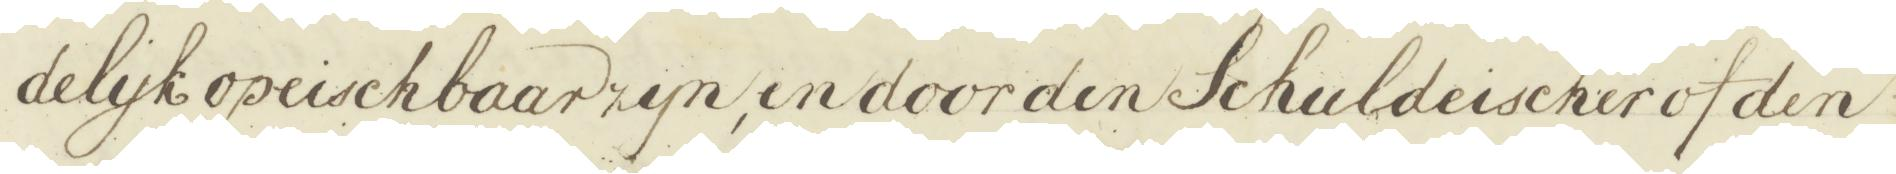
delijk opeischbaar zijn, en door den Schuldeischer of den
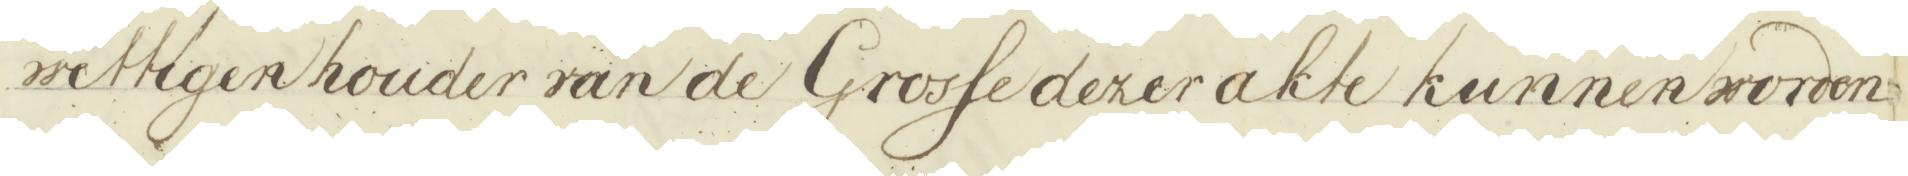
wettigen houder van de Grosse dezer akte kunnen worden
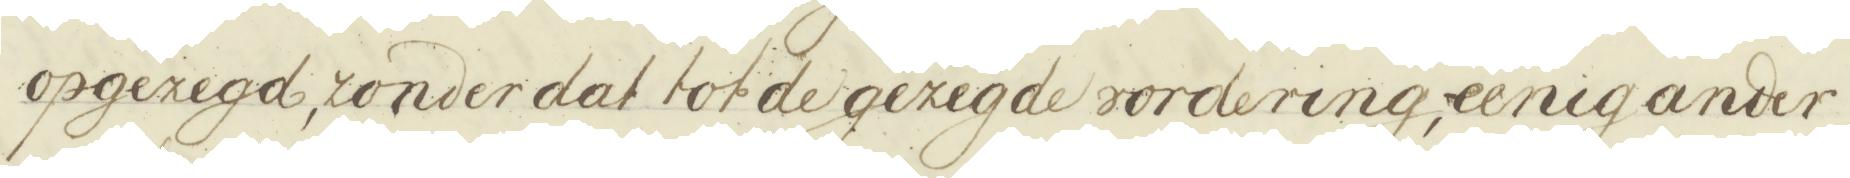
opgezegd, zonder dat tot de gezegde vordering, eenig ander
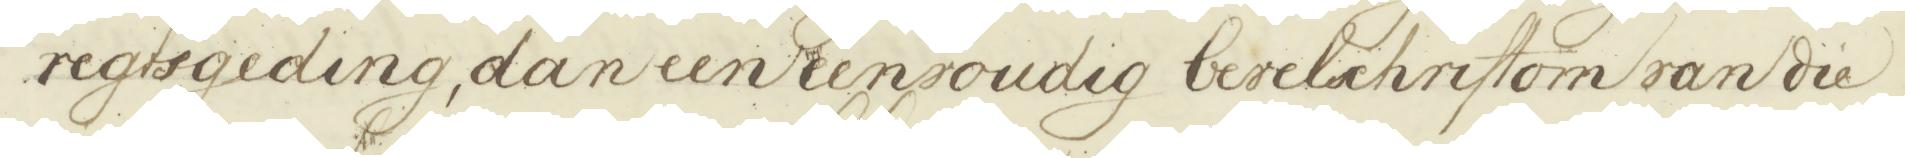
regtsgeding, dan een eenvoudig bevelschrift om van die
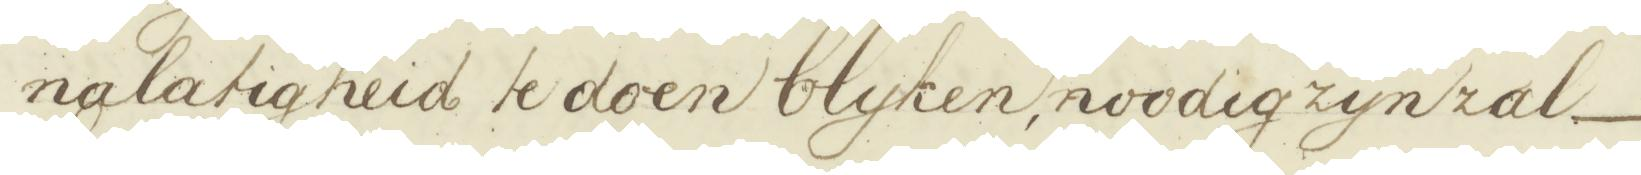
nalatigheid te doen blyken, noodig zyn zal—
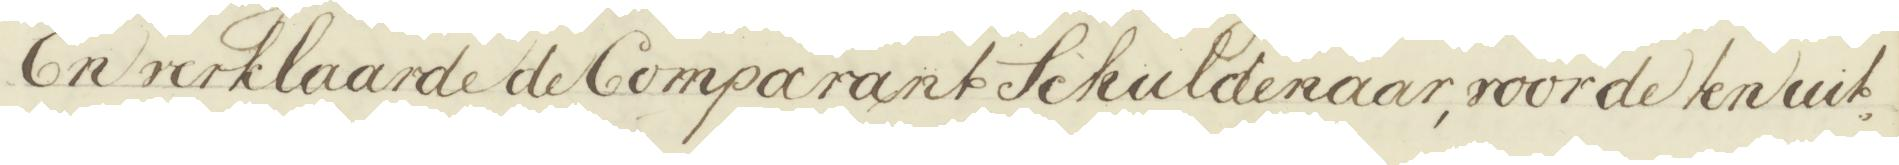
En verklaarde de Comparant schuldenaar, voor de ten uit„
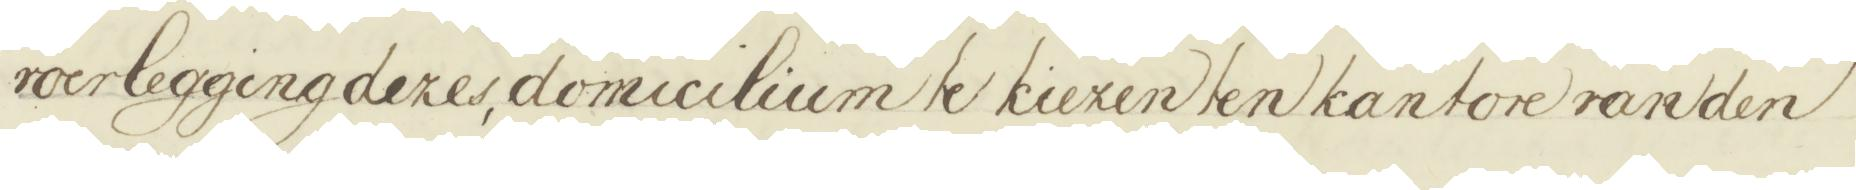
voerlegging dezes, domicilium te kiezen ten kantore van den
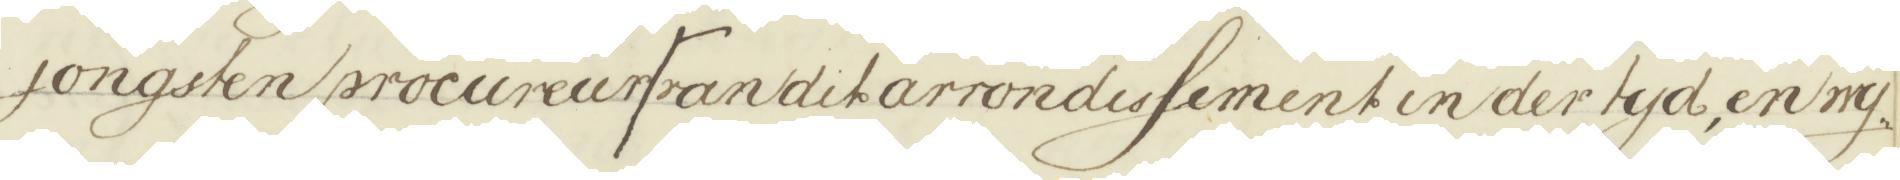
jongsten procureur ¶ van dit arrondissement in der tyd, en wy„
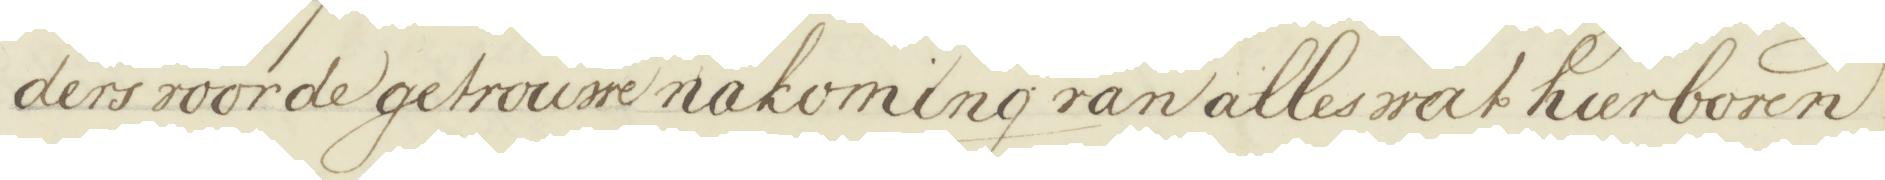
ders voor de getrouwe nakoming van alles wat hierboven
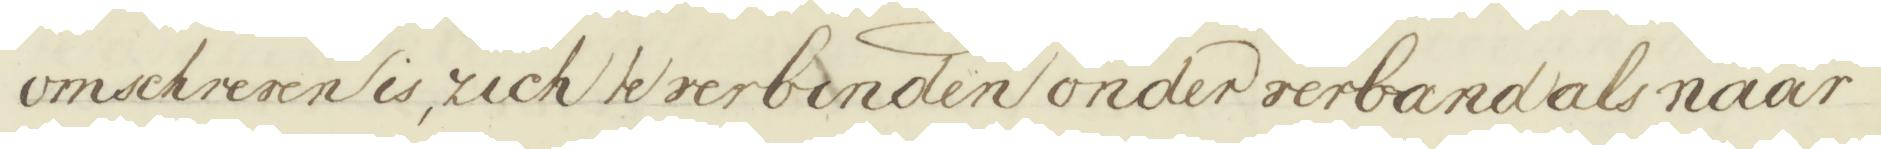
omschreven is, zich te verbinden onder verband als naar
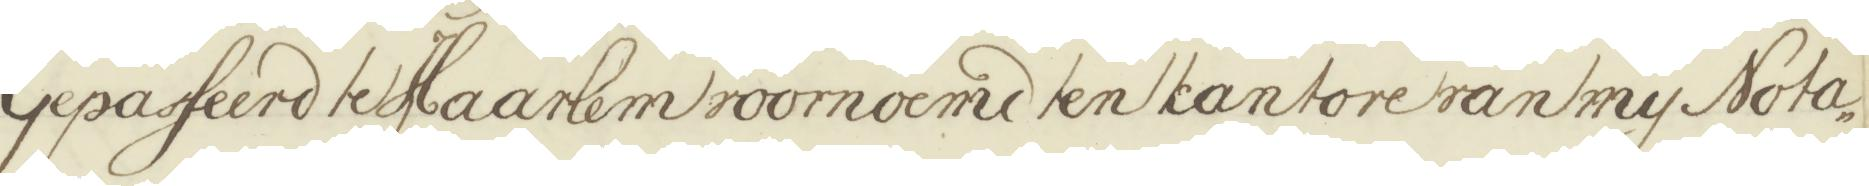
Gepasseerd te Haarlem voornoemd ten kantore van my Nota„
